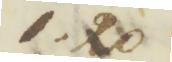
1.20
